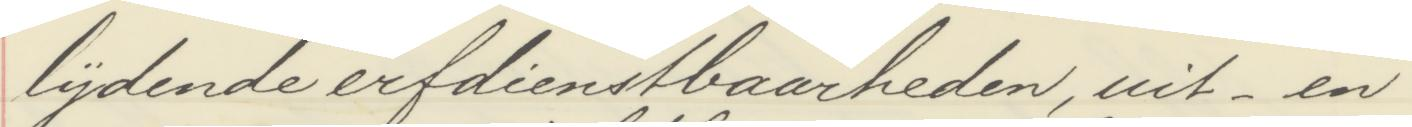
lijdende erfdienstbaarheden, uit- en
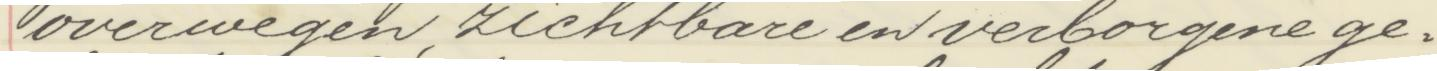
overwegen, zichtbare en verborgene ge„
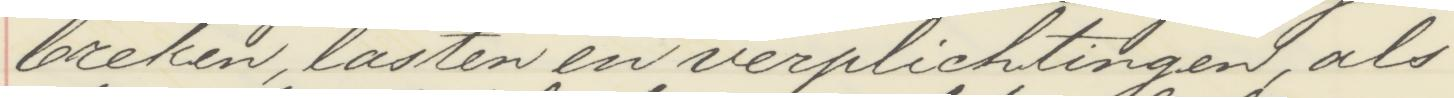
breken, lasten en verplichtingen, als
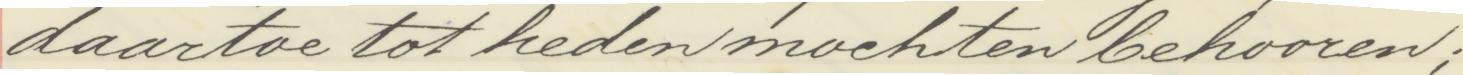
daartoe tot heden mochten behooren;
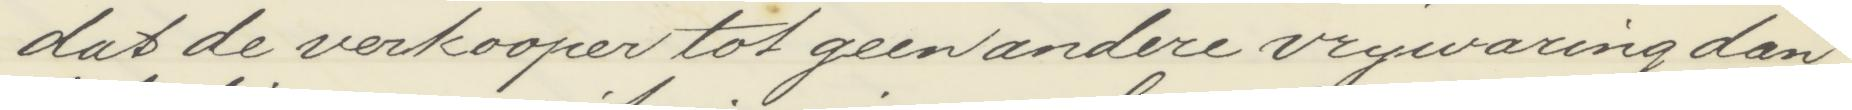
dat de verkooper tot geen andere vrywaring dan
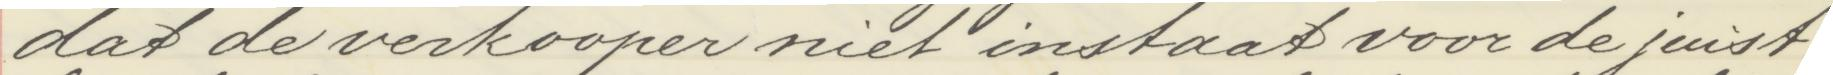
dat de verkooper niet instaat voor de juist
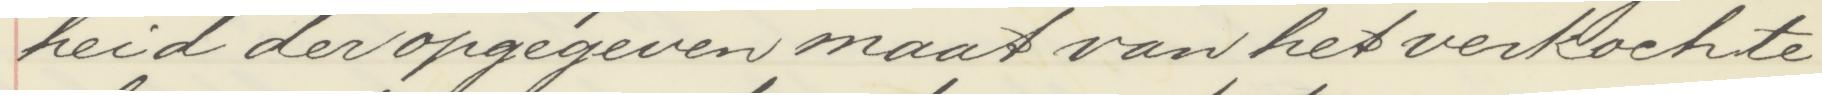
heid der opgegeven maat van het verkochte
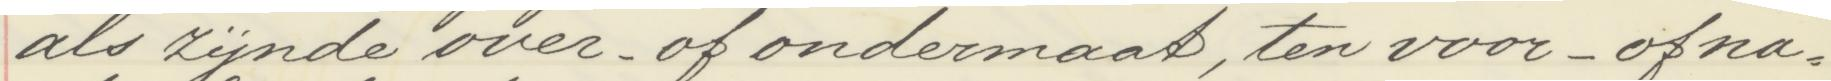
als zijnde over- of ondermaat, ten voor- of na=
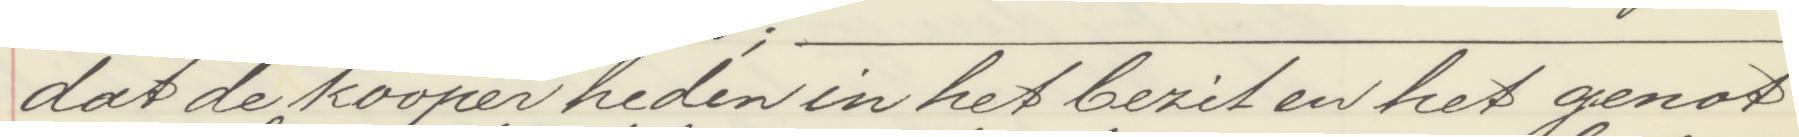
dat de kooper heden in het bezit en het genot
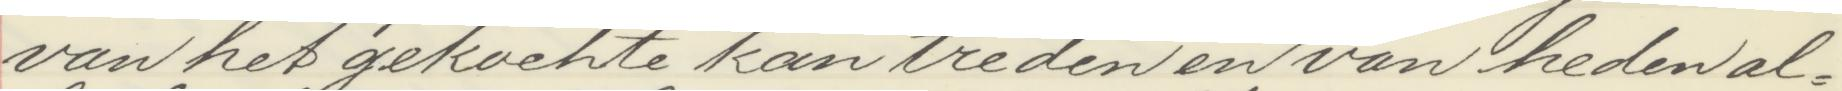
van het gekochte kan treden en van heden al=
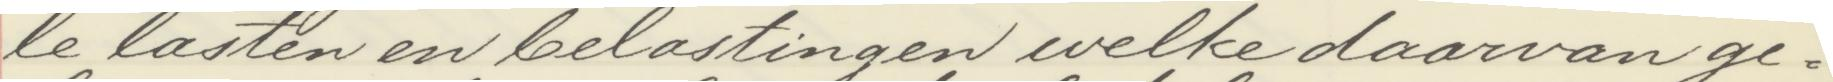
le lasten en belastingen welke daarvan ge=
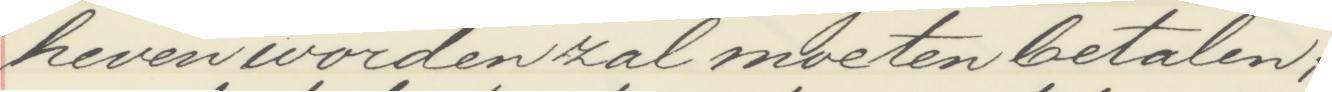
heven worden zal moeten betalen;
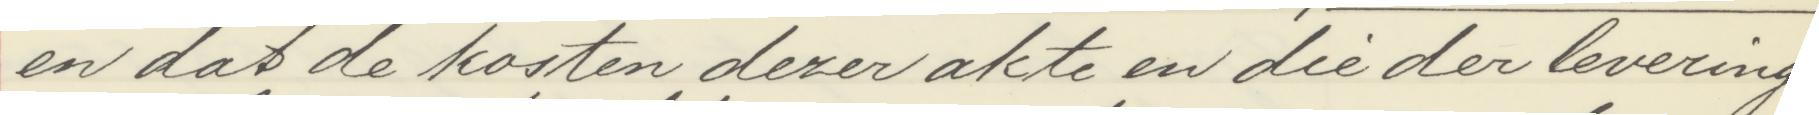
en dat de kosten dezer akte en die der levering
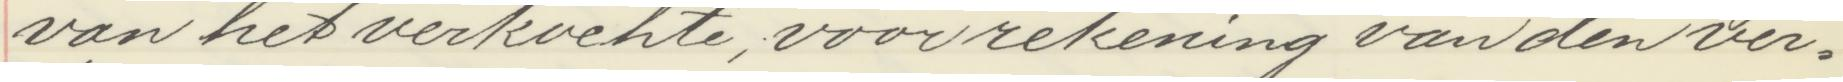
van het verkochte, voor rekening van den ver=
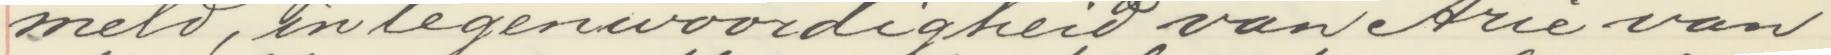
meld, in tegenwoordigheid van Arie van
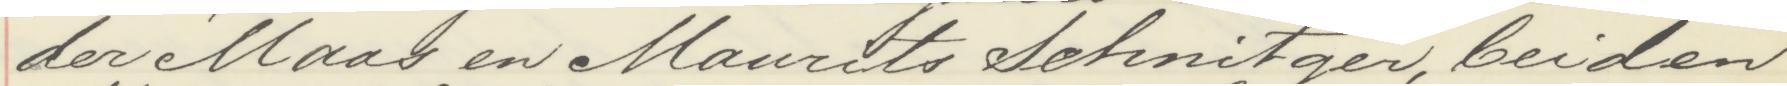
der Maas en Maurits Schnitger, beiden
